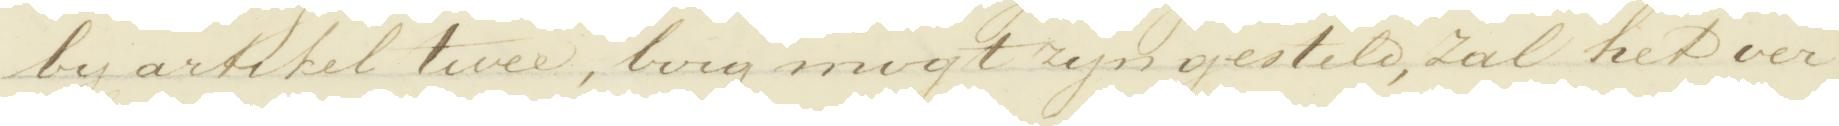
by artikel twee, borg mogt zyn gesteld, zal het ver
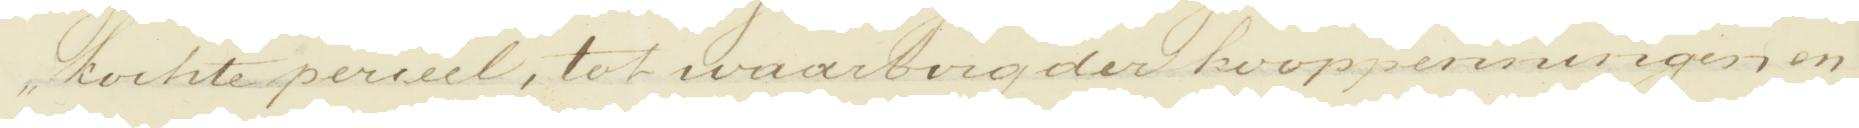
„ kochte perceel, tot waarborg der kooppenningen en
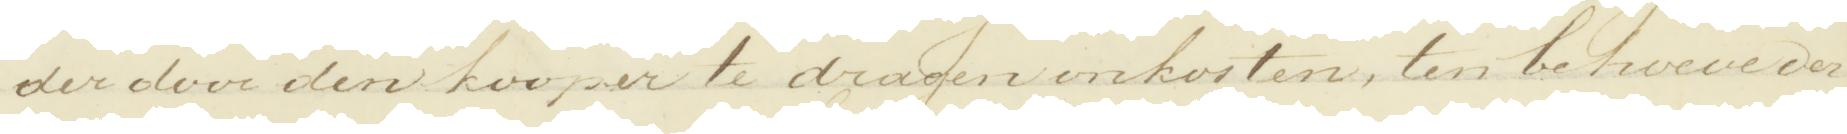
der door den kooper te dragen inkosten, ten behoeve der
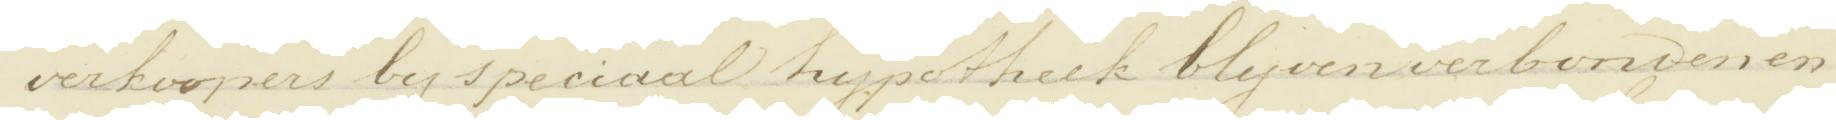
verkoopers by speciaal hypotheek blyven verbonden en
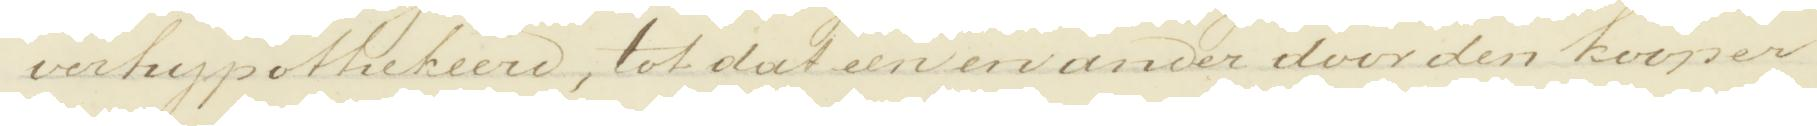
verhypothekeerd, tot dat een en ander door den kooper
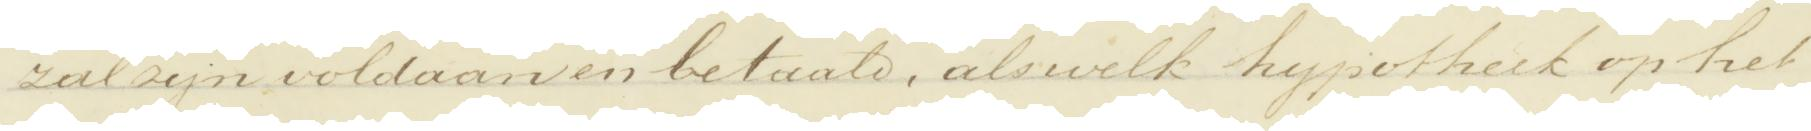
zal zijn voldaan en betaald, als welk hypotheek op het
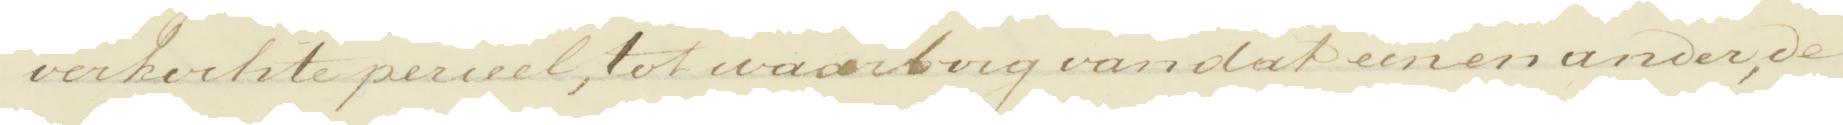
verkochte perceel, tot waarborg van dat een en ander de
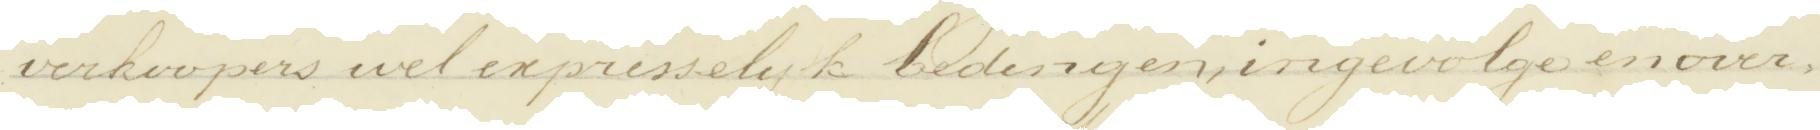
verkoopers wel expresselijk bedingen ingevolge en over„
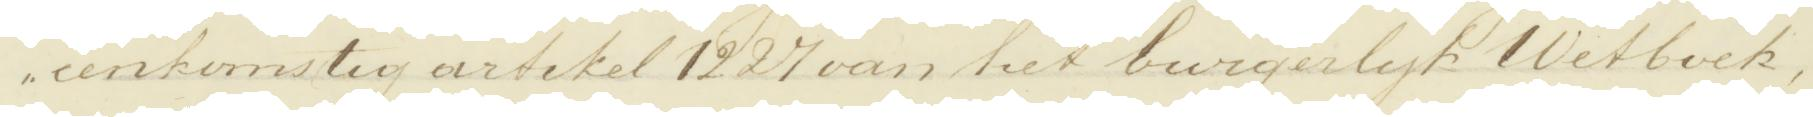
„eenkomstig artikel 1227 van het burgerlijk Wetboek,
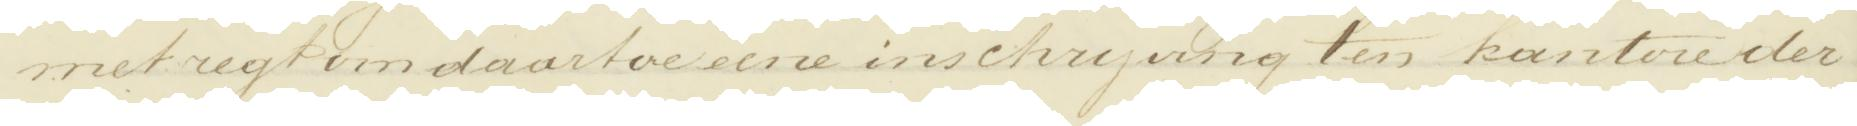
met regt om daartoe eene inschryving ten kantore der
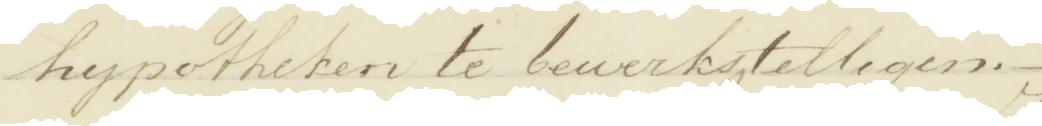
hypotheken te bewerkstelligen.
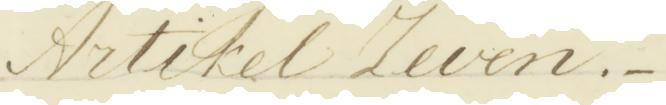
Artikel Zeven.-
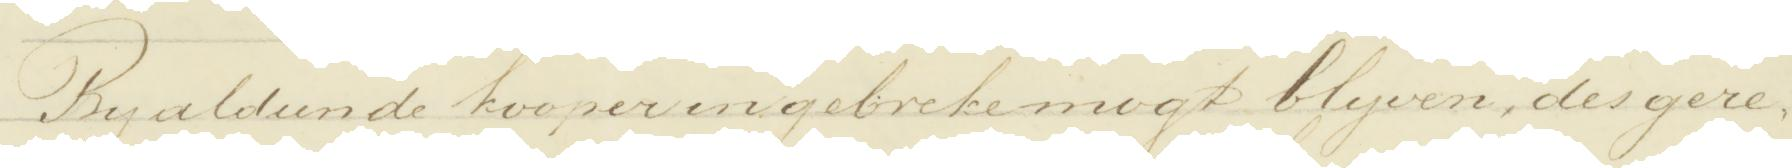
Bij aldien de kooper in gebreke mogt blyven, des gere
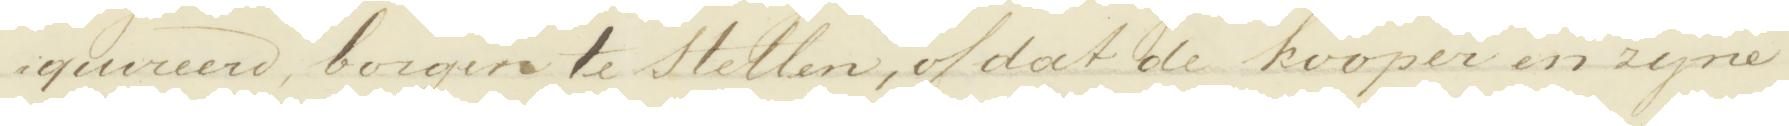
quireerd, borgen te stellen, of dat de kooper en zyne
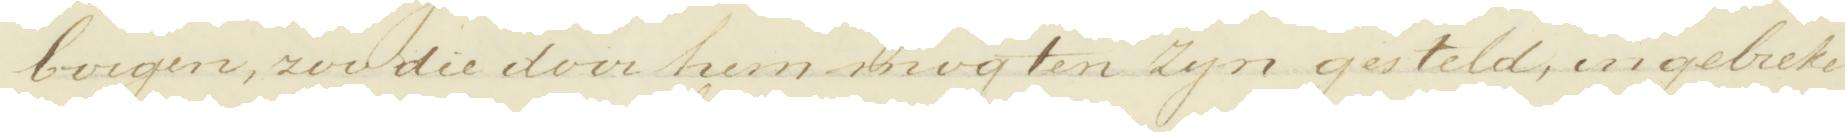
borgen, zoo die door hem mogten zyn gesteld, in gebreke
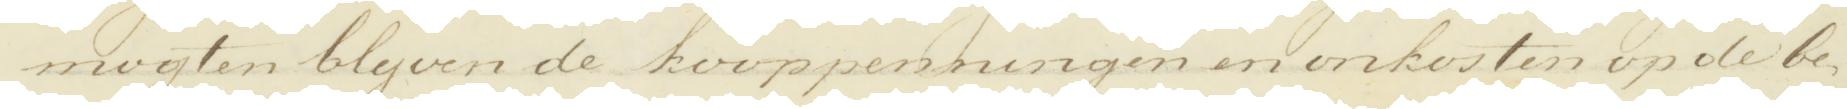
mogten blijven de kooppenningen en onkosten op de be,
